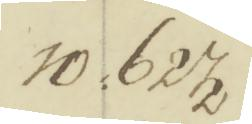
10„62½
